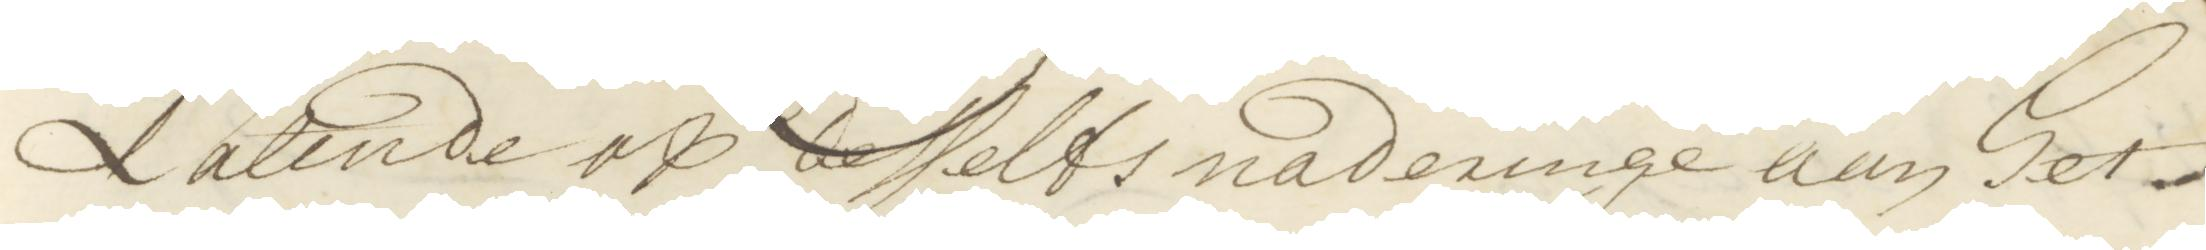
Latende op desselfs naderinge aan het
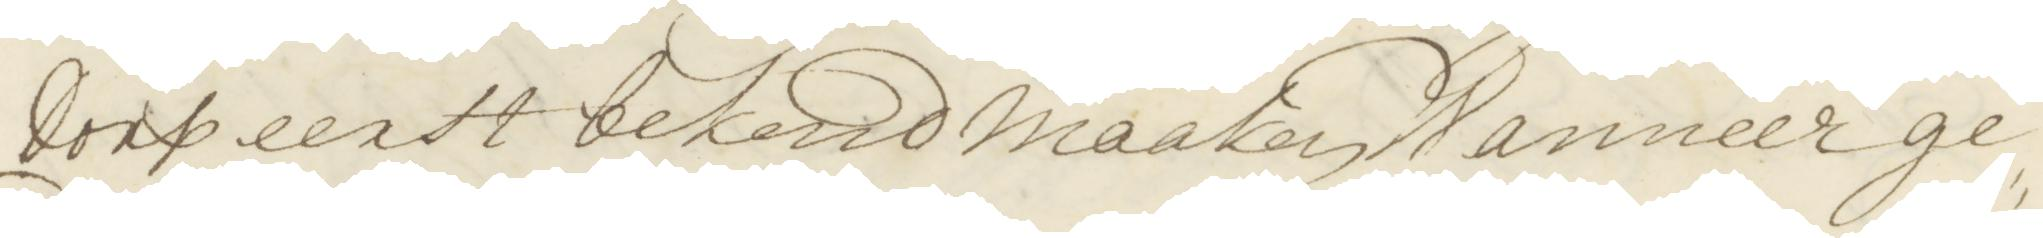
dorp eerst bekend maaken wanneer ge„
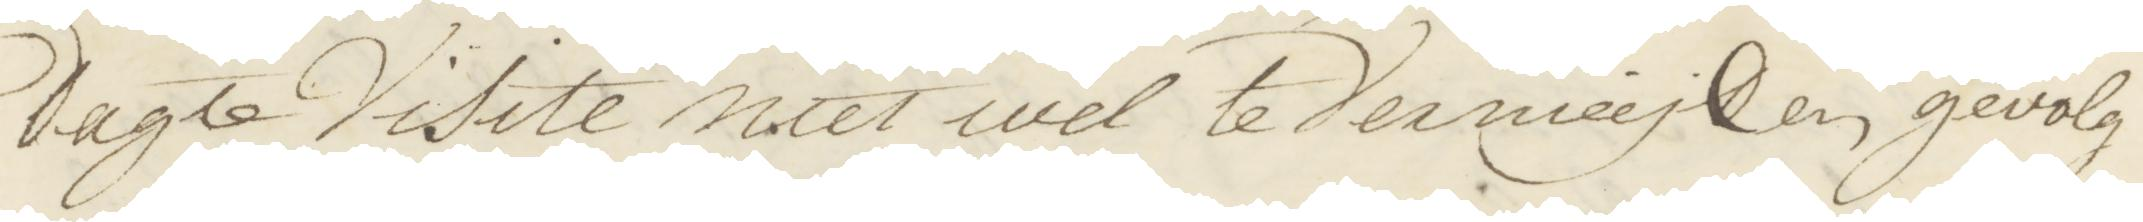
dagte visite niet wel te vermeijden gevolg
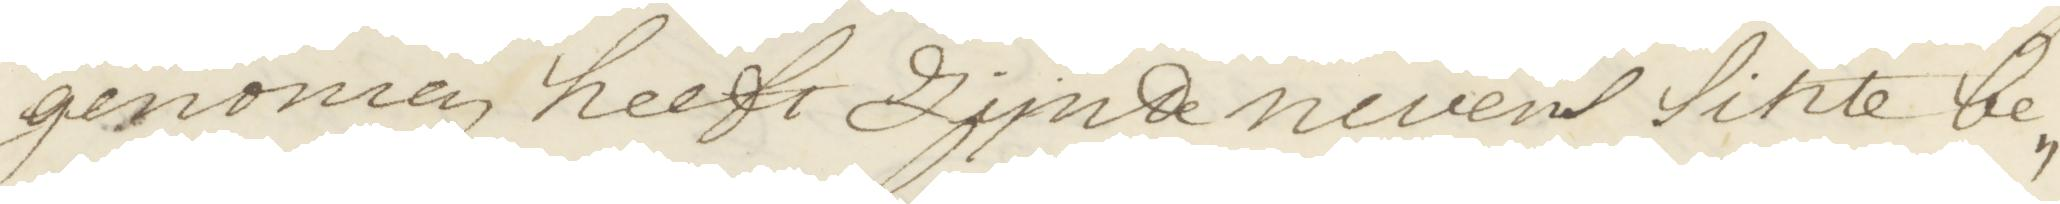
genomen heeft zijnde nevens sinte be„
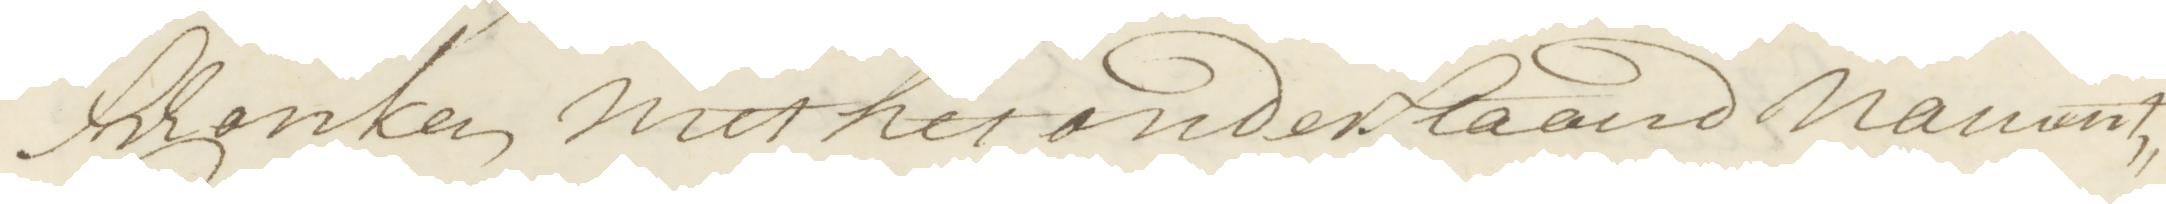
schenken met het onderstaand nament„
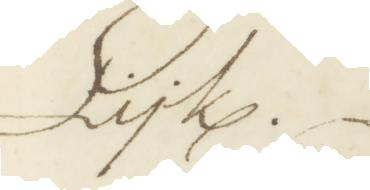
lijk.
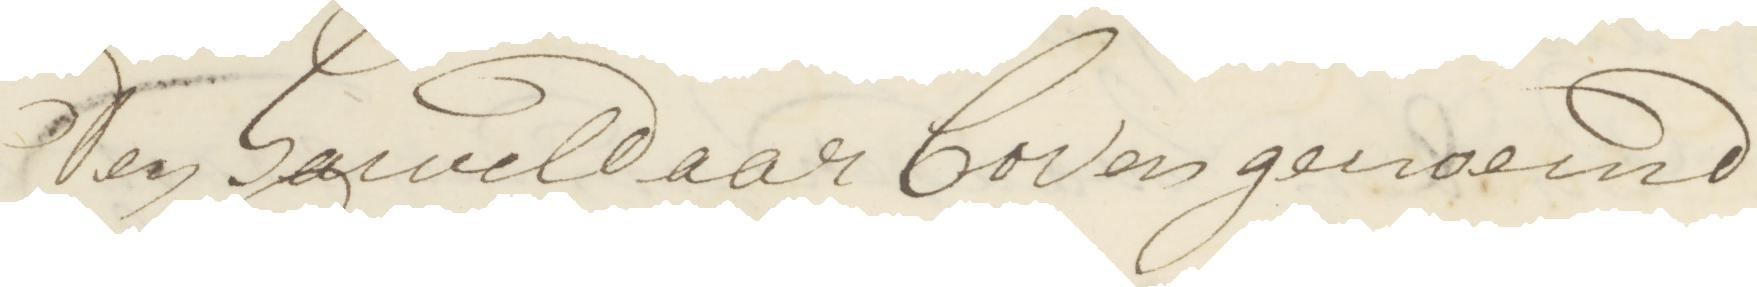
den hawel daar boven genoemd
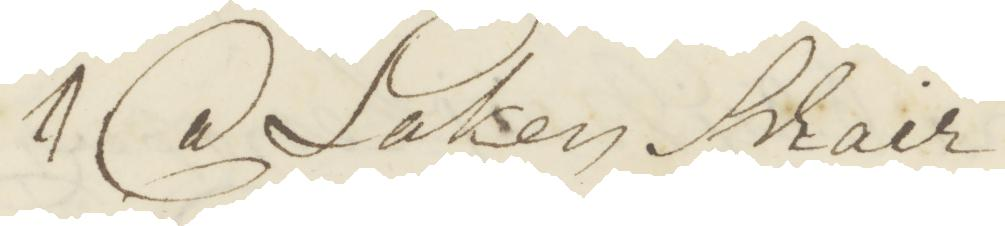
4 @ Laken schair
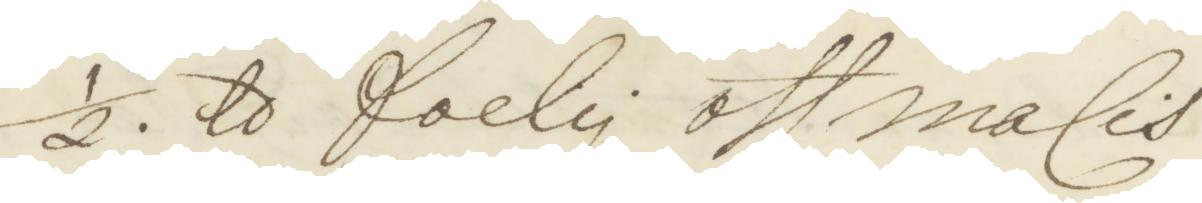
1/2. ld foelij off macis
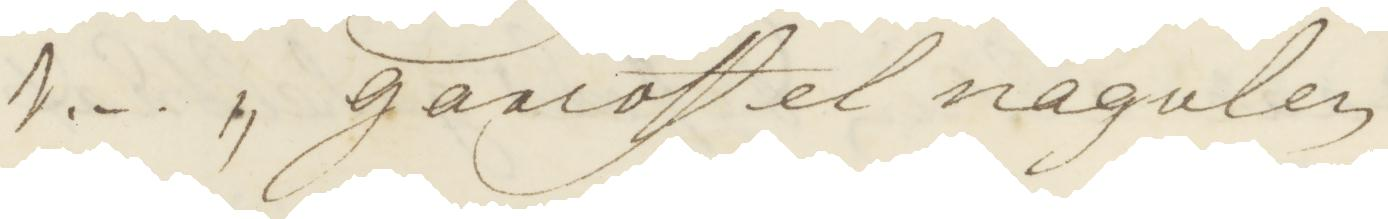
1.–. „ garioffel nagulen
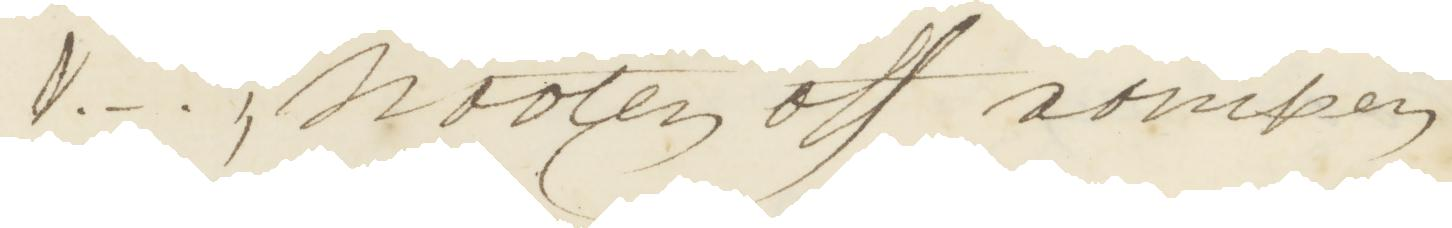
1.–. „ nooten off rompen
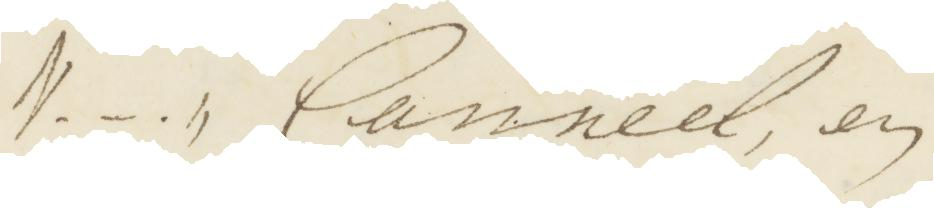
1.–.„ Canneel, en
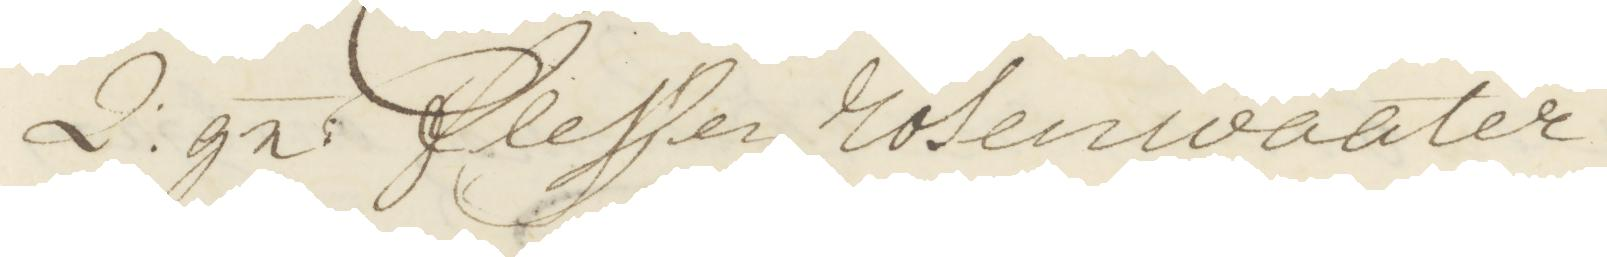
2: gr: flessen rosenwaater
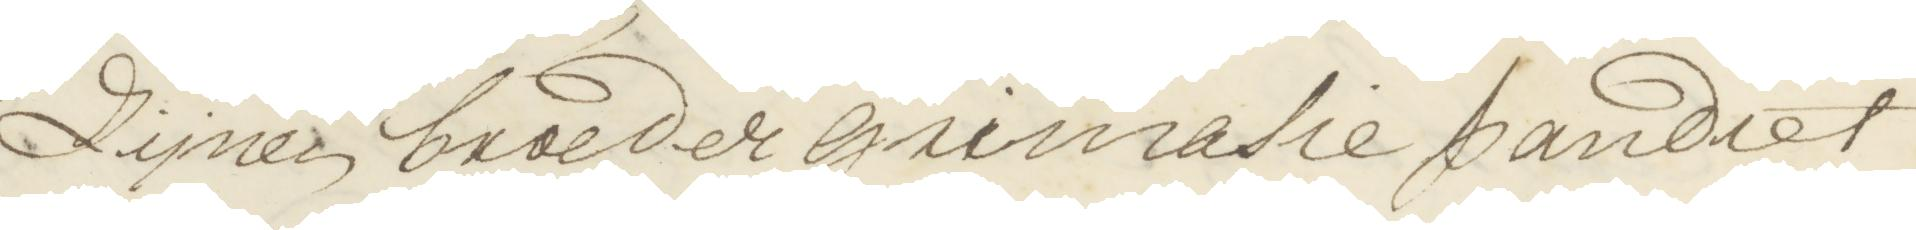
zijnen broeder grimasie pandiet
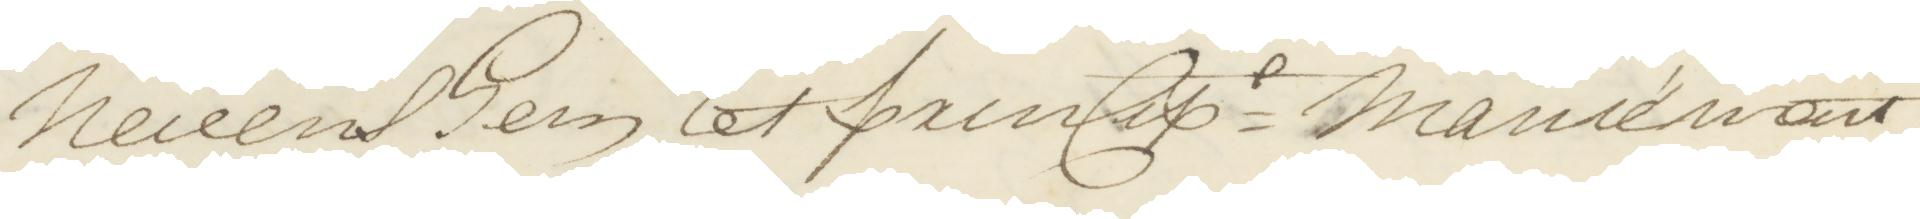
nevens hem het princip=l maniement
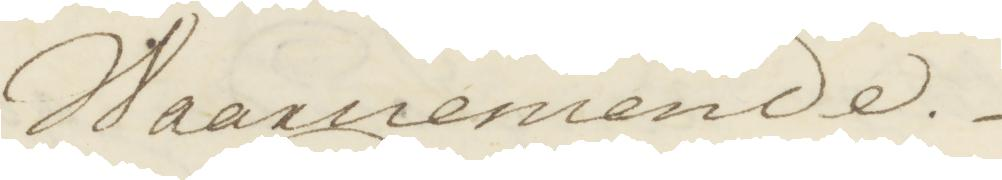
Waarnemende._
